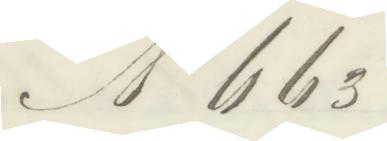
No 663
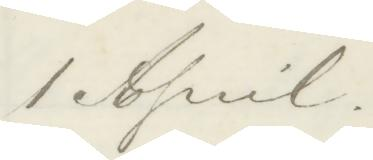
1 April.
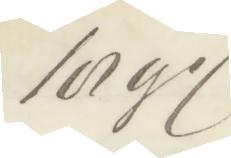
1897
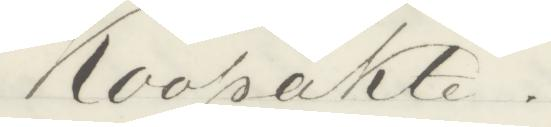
Koopakte.
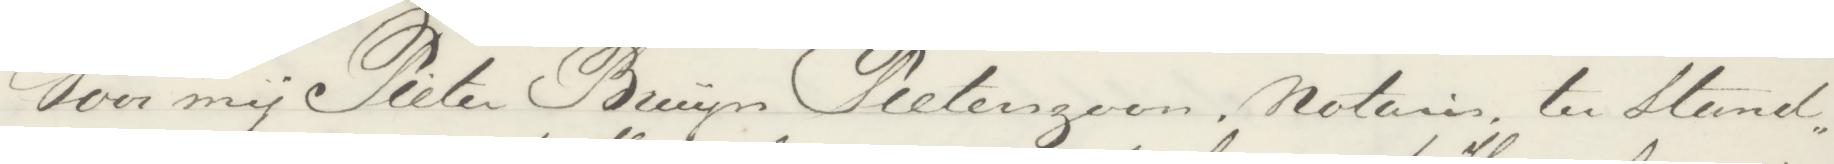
Voor mij Pieter Bruijn Pieterszoon, Notaris, ter stand
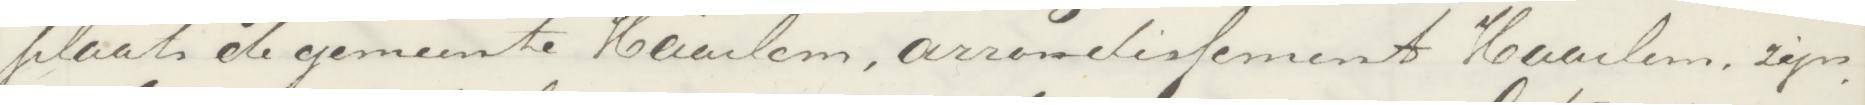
plaats de gemeente Haarlem, arrondissement Haarlem, zijn,
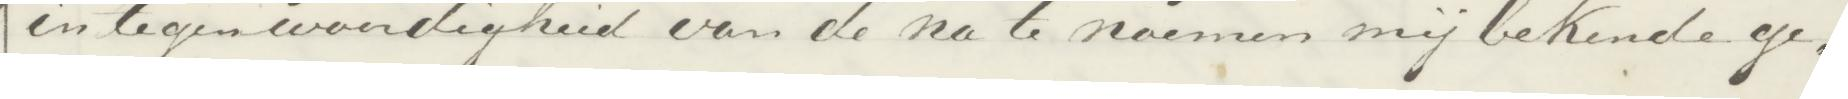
in tegenwoordigheid van de na te noemen mij bekende ge„
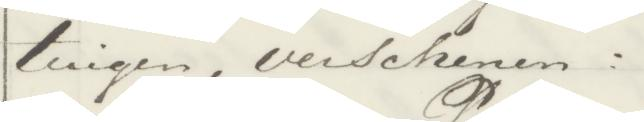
tuigen, verschenen:
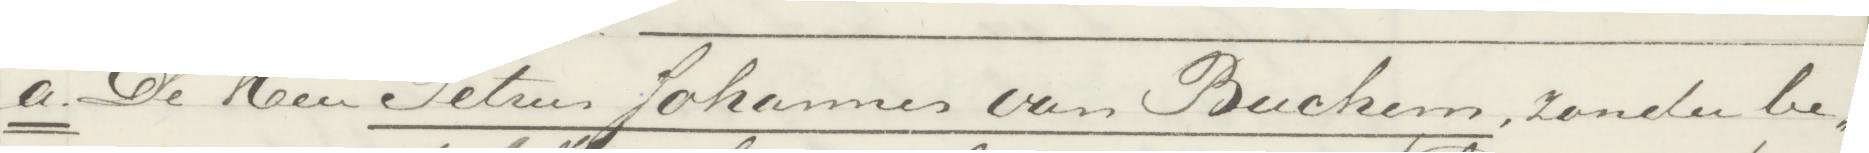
a. De Heer Petrus Johannes van Buchem, zonder be„
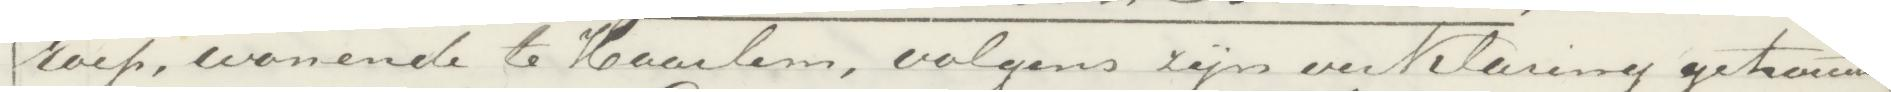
roep, wonende te Haarlem, volgens zijn verklaring getrouwd
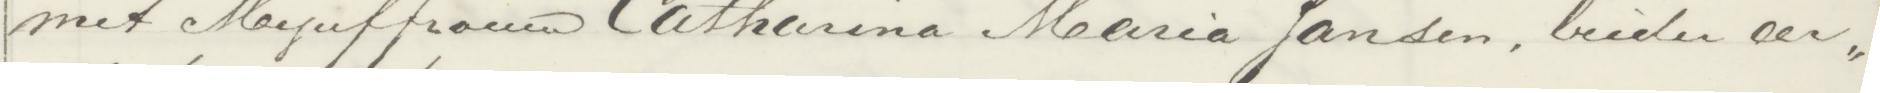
met Mejuffrouw Catharina Maria Jansen, beiden eer„
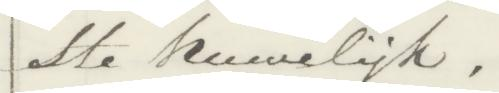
ste huwelijk,
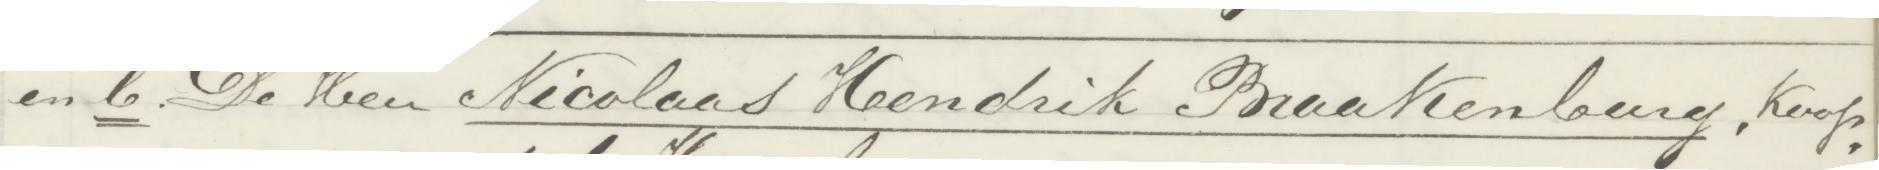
en b. De Heer Nicolaas Hendrik Braakenburg, koop„
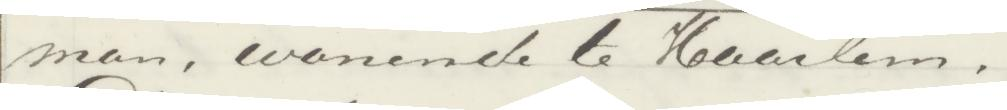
man, wonende te Haarlem.
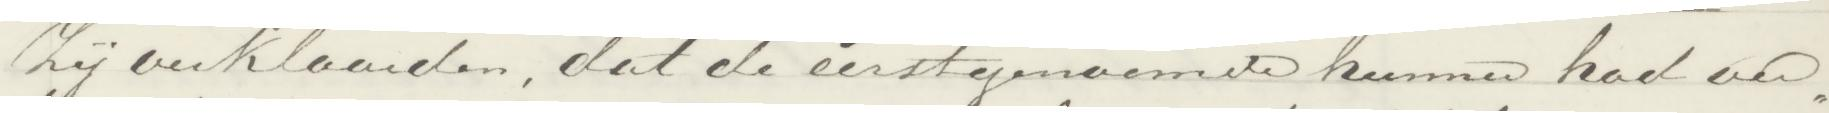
Zij verklaarden, dat de eerstgenoemde hunner had ver„
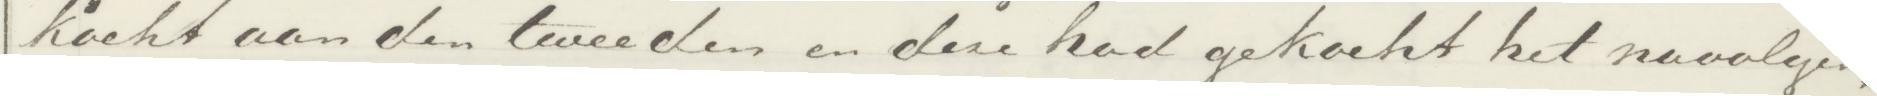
kocht aan den tweeden en deze had gekocht het navolgen„
